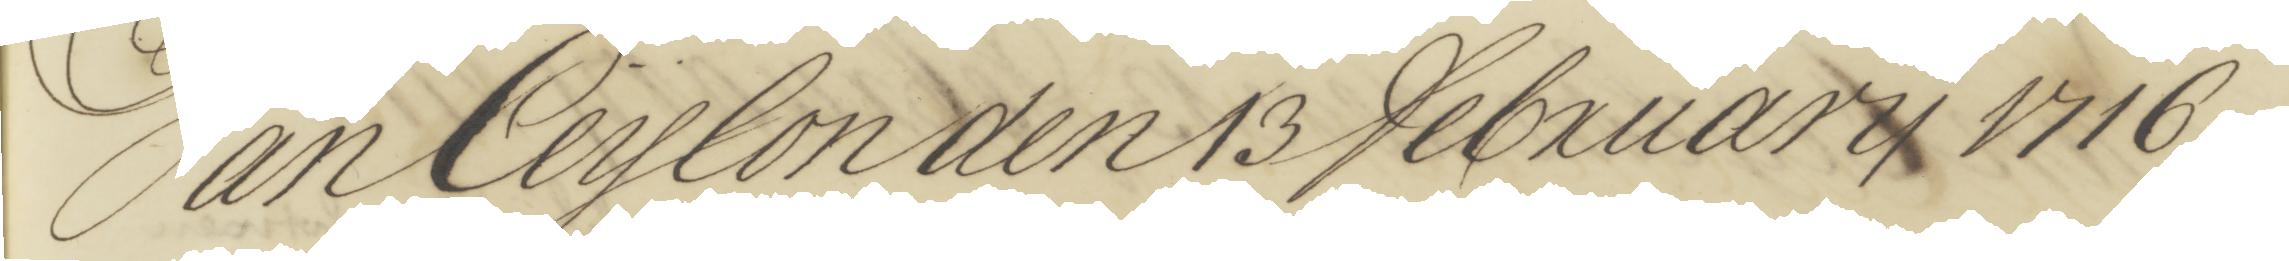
Van Ceijlon den 13 februarij 1716
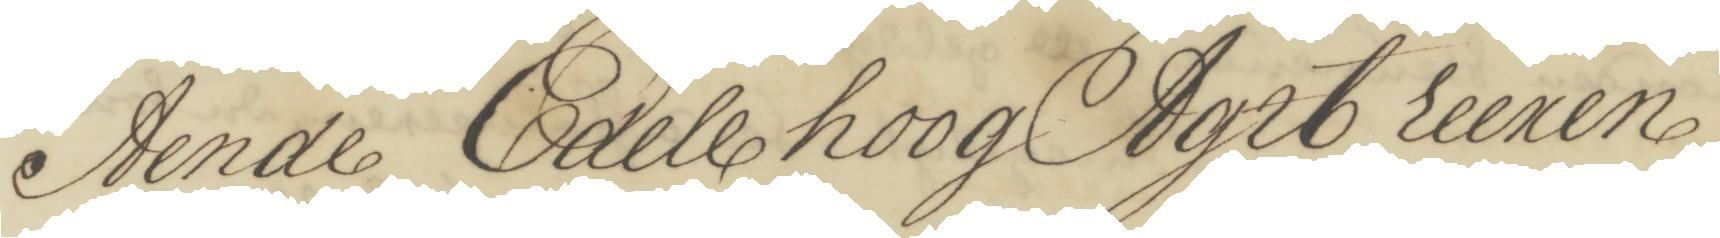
Aende Edele hoog Agtb heeren
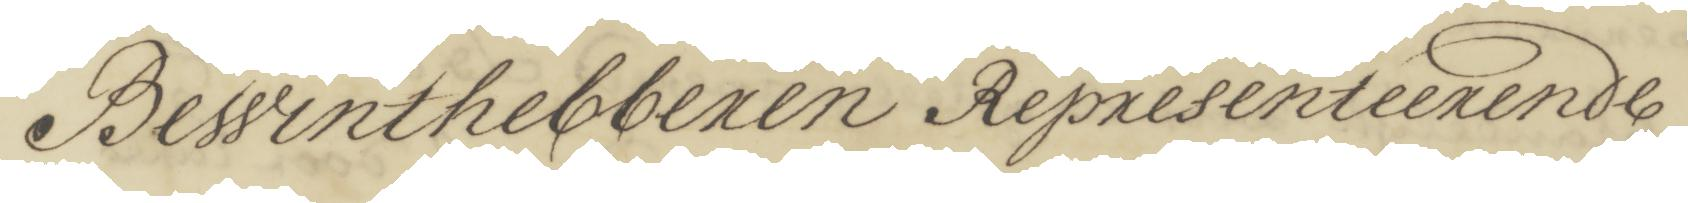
Bewinthebberen Representeerende
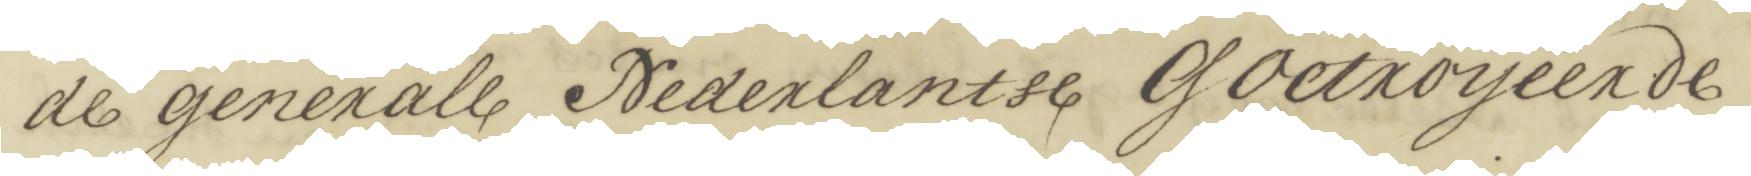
de generale Nederlantse Goctroijeerde
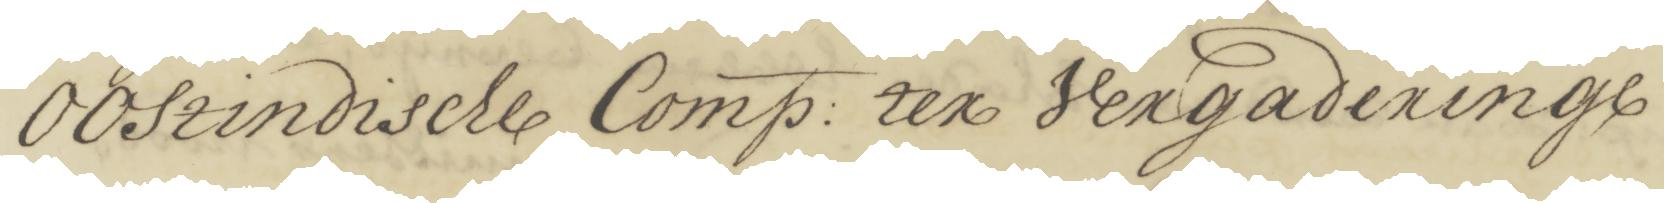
Oostindische Comp: ter vergaderinge
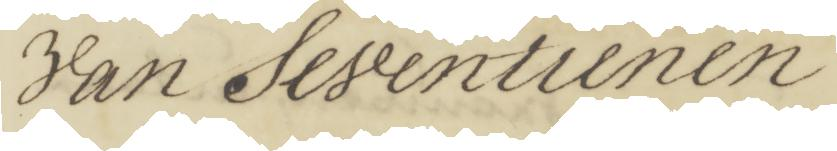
Van Seventienen
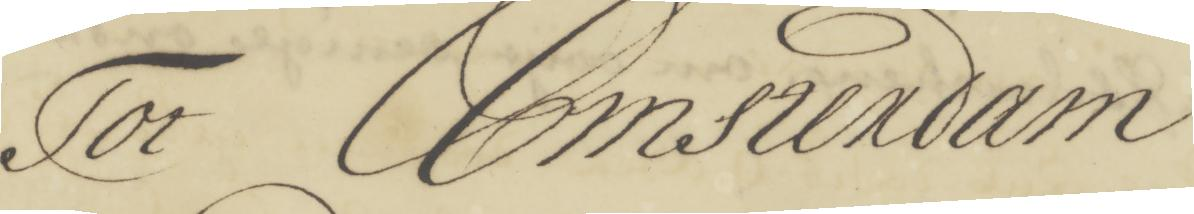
Tot Amsterdam
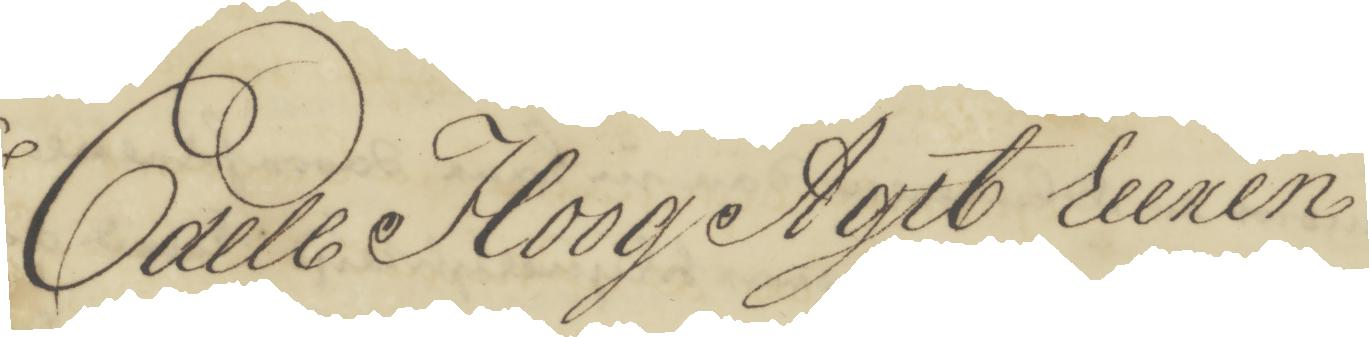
Edele Hoog Agtb heeren
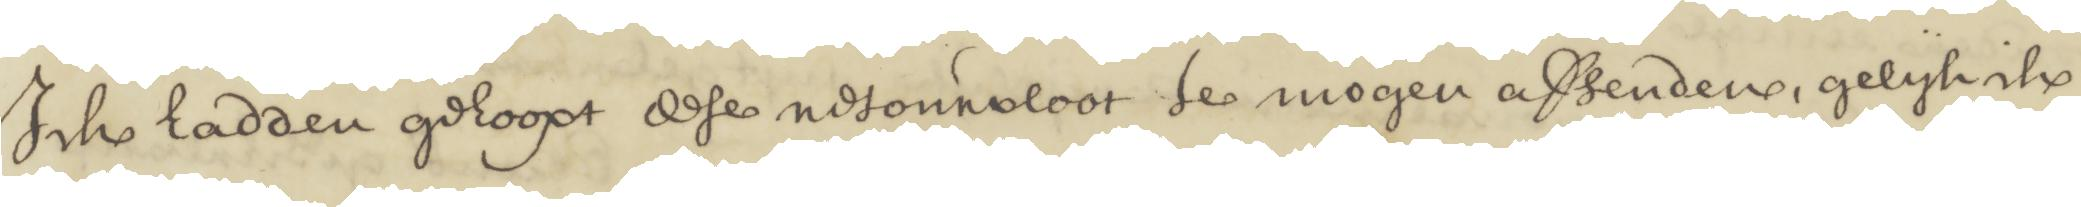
Ick hadden gehoopt dese retourvloot te mogen afsenden, gelijk ik
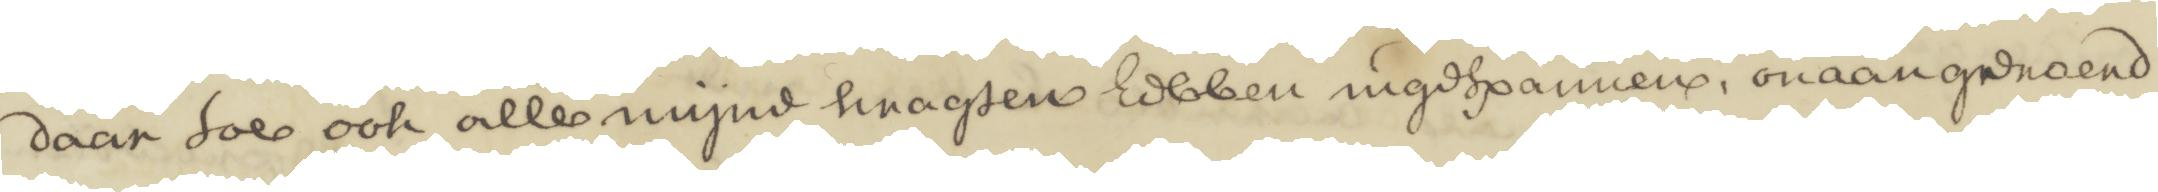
daar toe ook alle mijne kragten hebben ingespannen, onaan geroerd
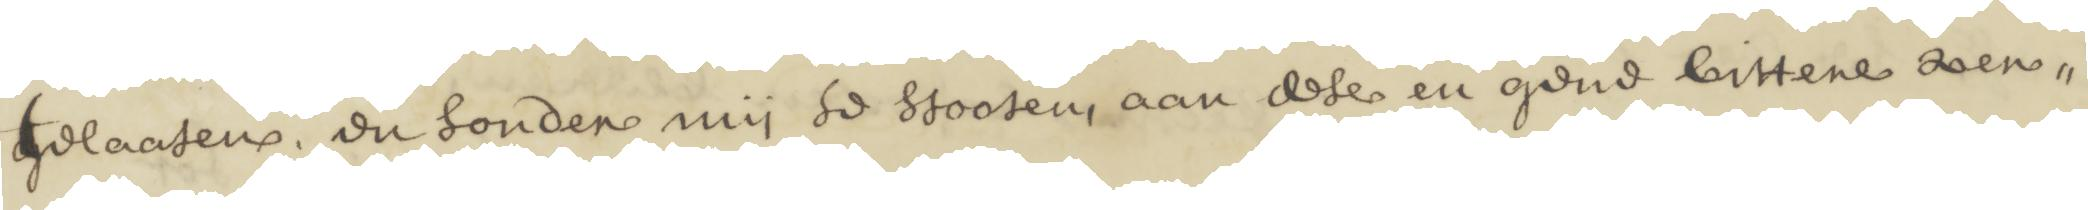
telaaten, en sonder mij te stooten, aan dese en gene bittere ver„
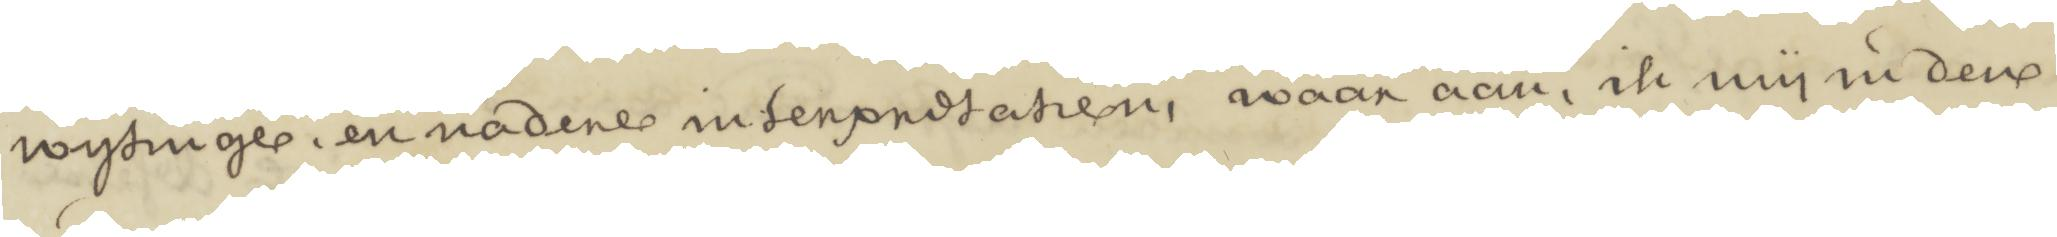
wijtinge, en nadere interpretatien, waar aan, ik mij in den
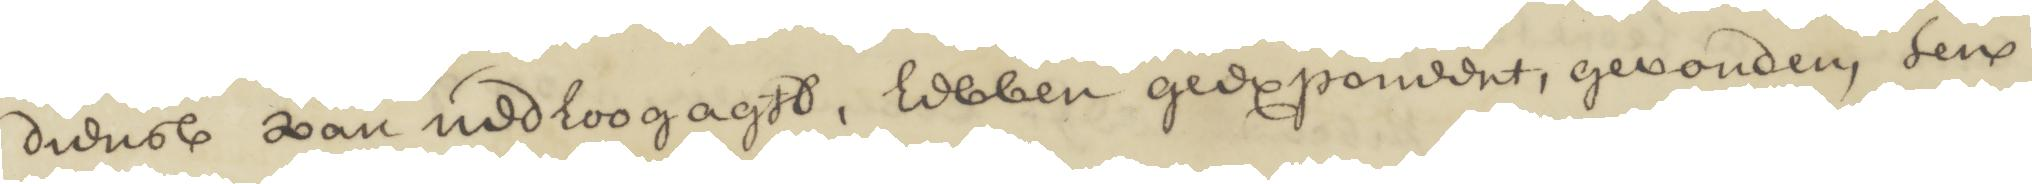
dienst van uEd hoog agtb, hebben geexponeert, gevonden, ten
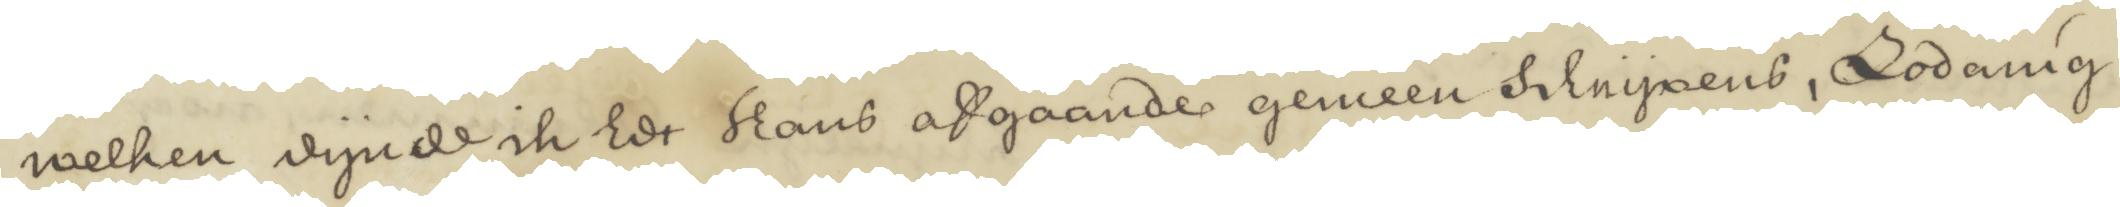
welken eijnde ik het thans afgaande gemeen schrijvens, zodanig
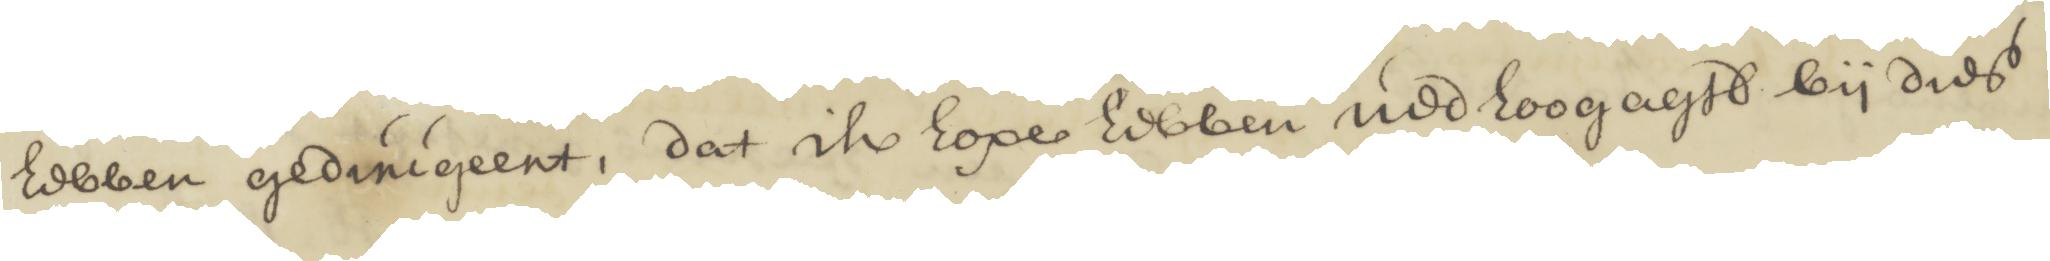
hebben gedirigeert, dat ik hope hebben uEd hoog agtb bij dies
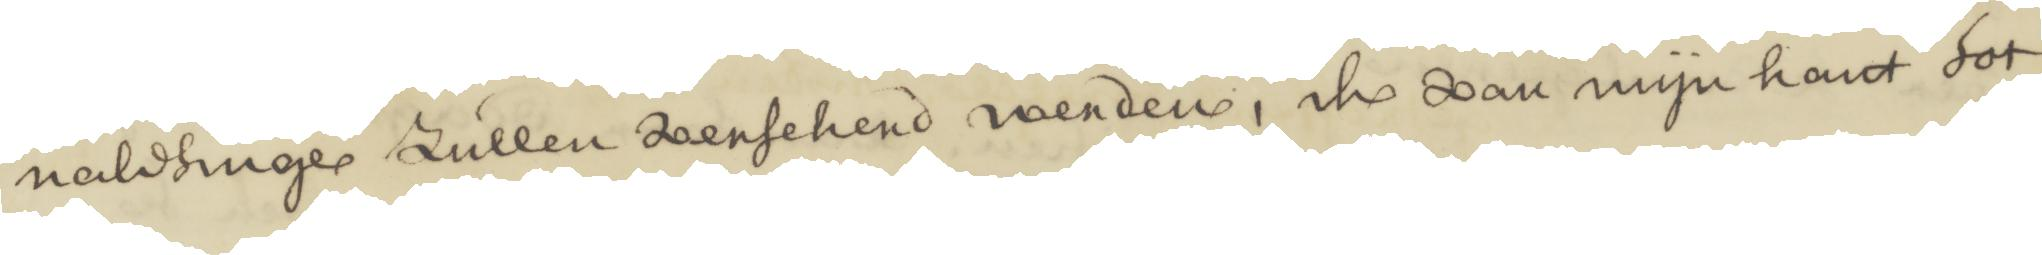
nalesinge zullen versekerd werden, ik van mijn kant tot
